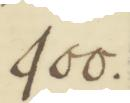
400.
